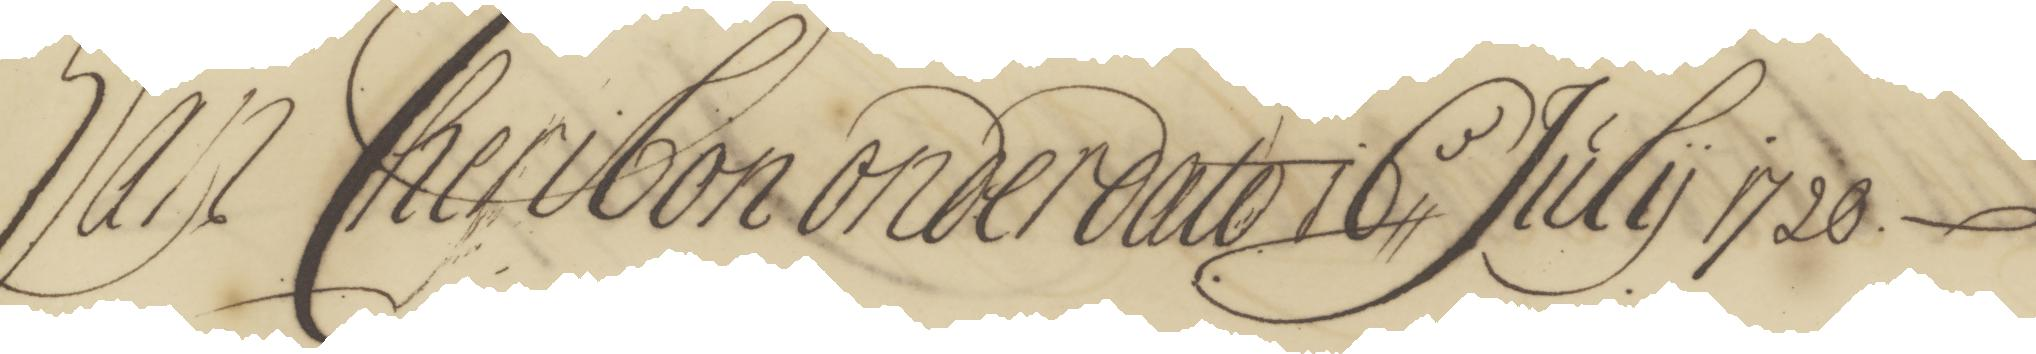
Van Cheribon onder dato 16„e Julij 1720. —
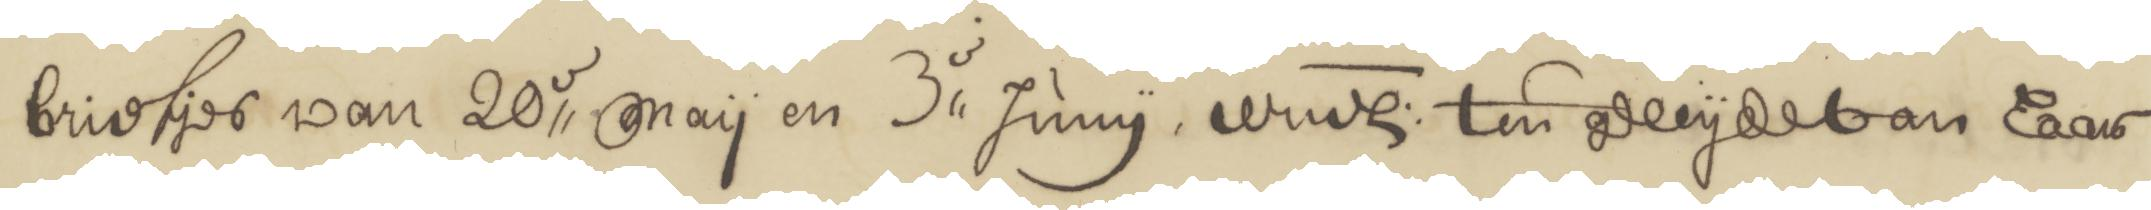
briefjes van 20„e maij en 3„e Junij, eenelijk: ten geleijde van haar
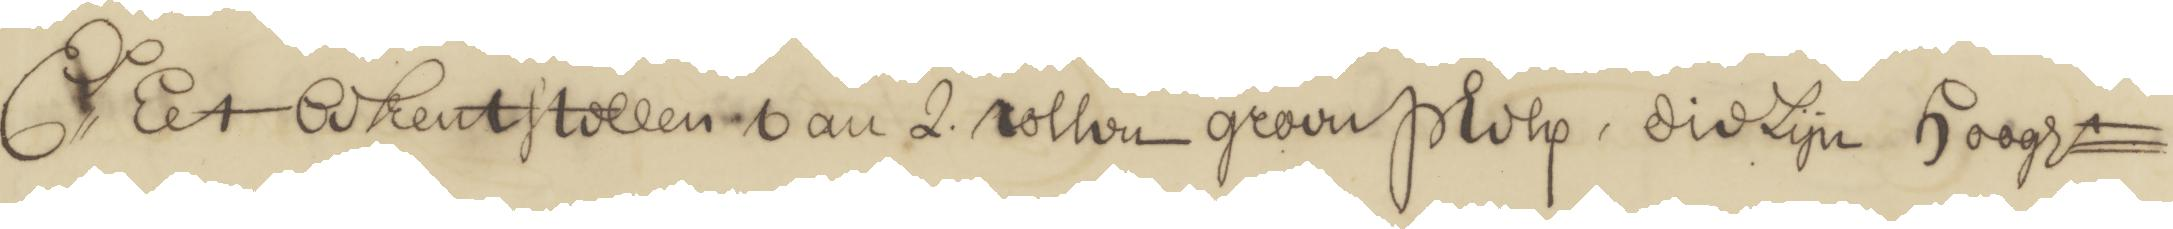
E„s het bekentstellen van 2. rollen groen phelp, diezijn Hoogh=t
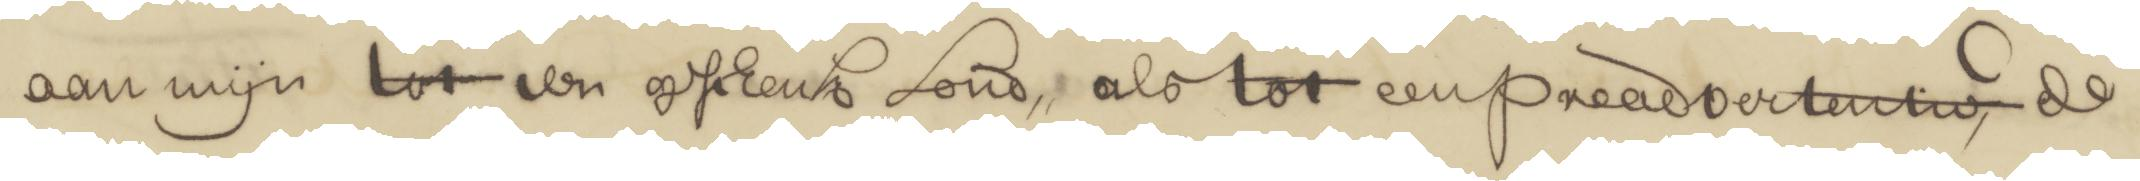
aan mijn tot een geschenk sond, als tot een preadvertentie, de
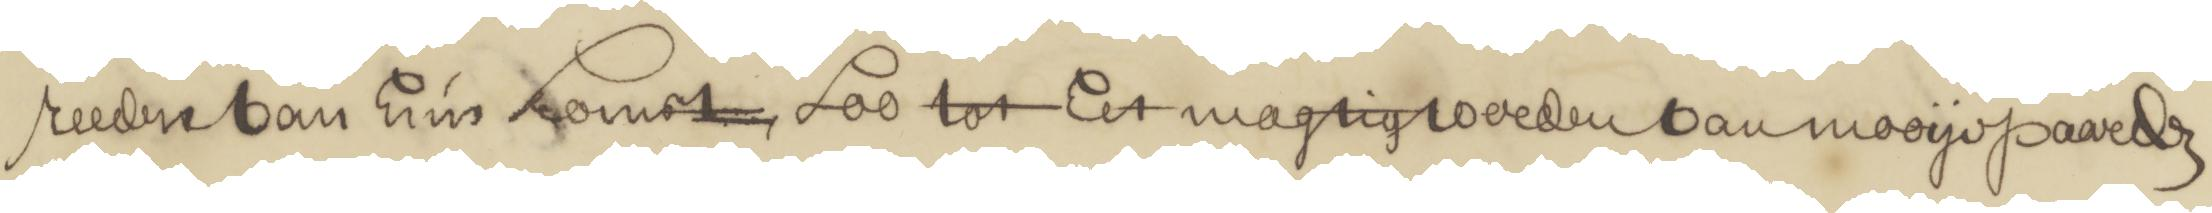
reeden van hun komst, soo tot het magtig worden van mooije paarden
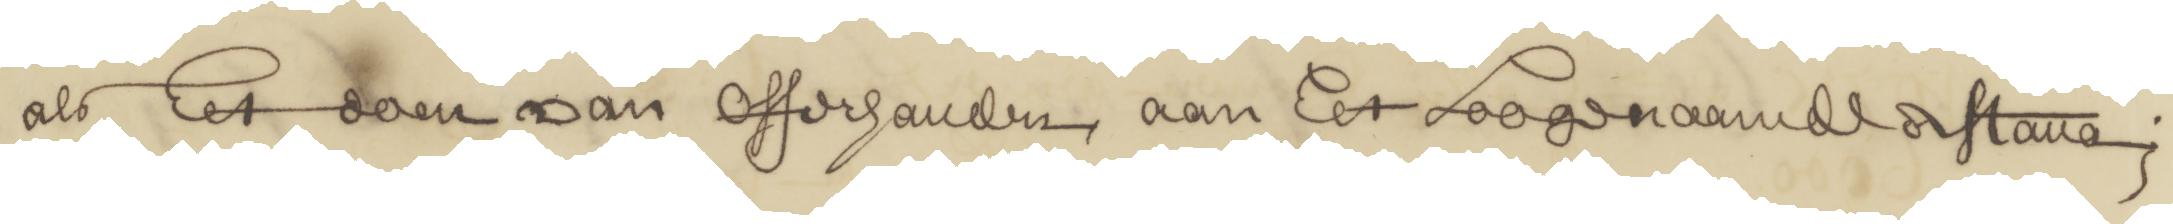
als het doen van offerhanden, aan het soogenaamde distana in
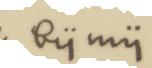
bij mij
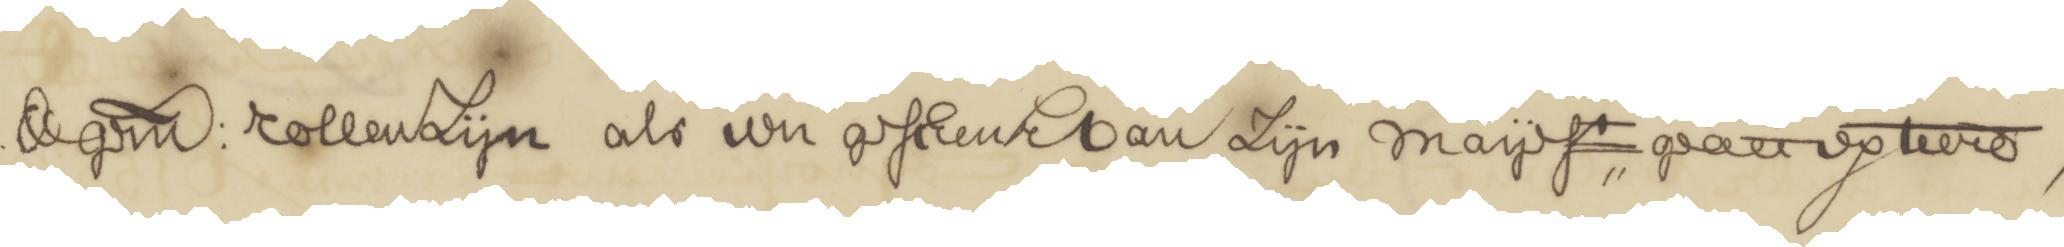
de gem: rollen zijn als een geschenk van zijn maijes=t geaccepteerd,
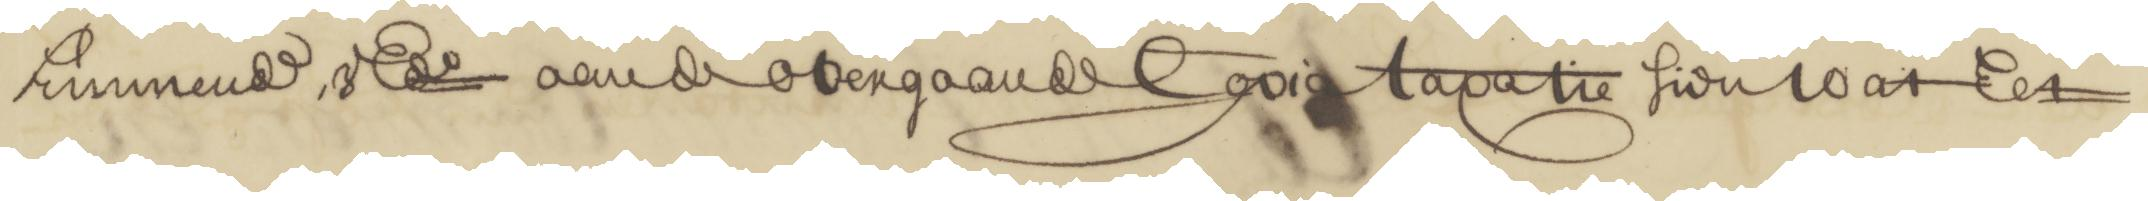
kunnende, VEd=o aan de overgaande Copia taxatie sien wat het
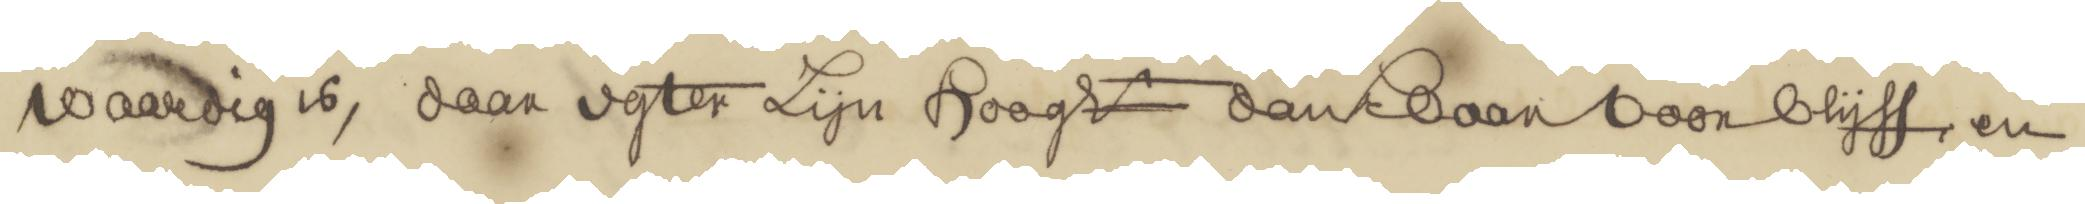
waardig is, daar egter zijn Hoogh=t dan daar voor blijff, en
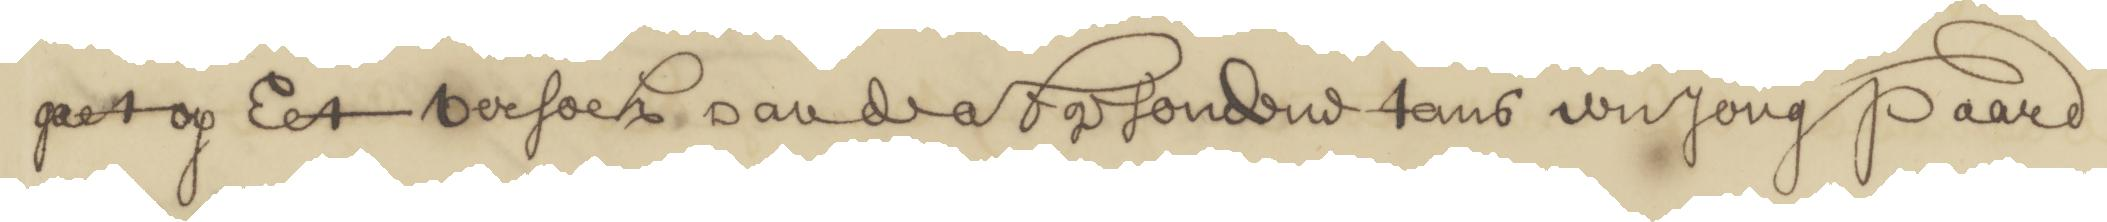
gaet op het versoek van de afgesondene tans een jong paard
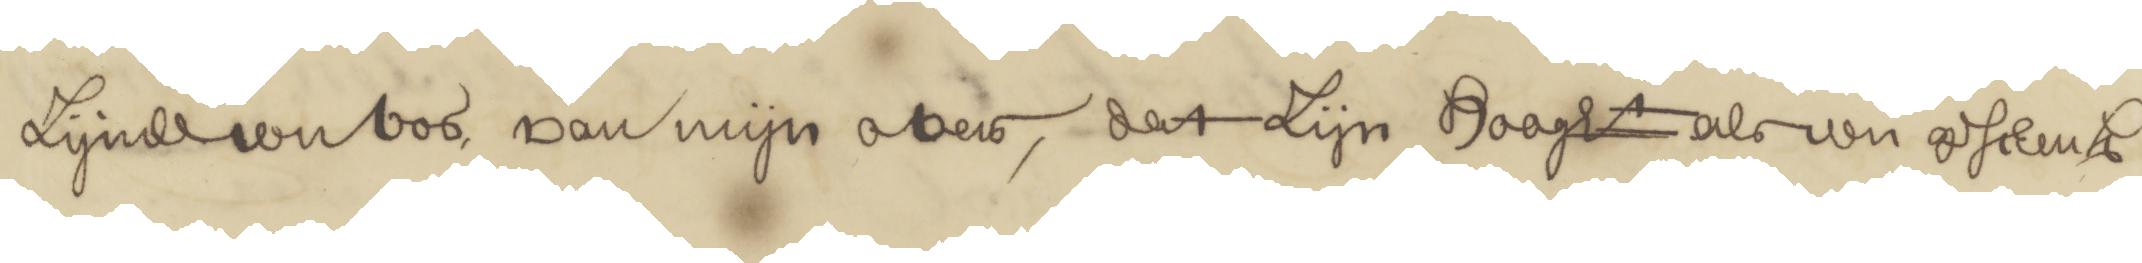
zijnde een vos, van mijn over, dat zijn Hoogh=t als een geschenk
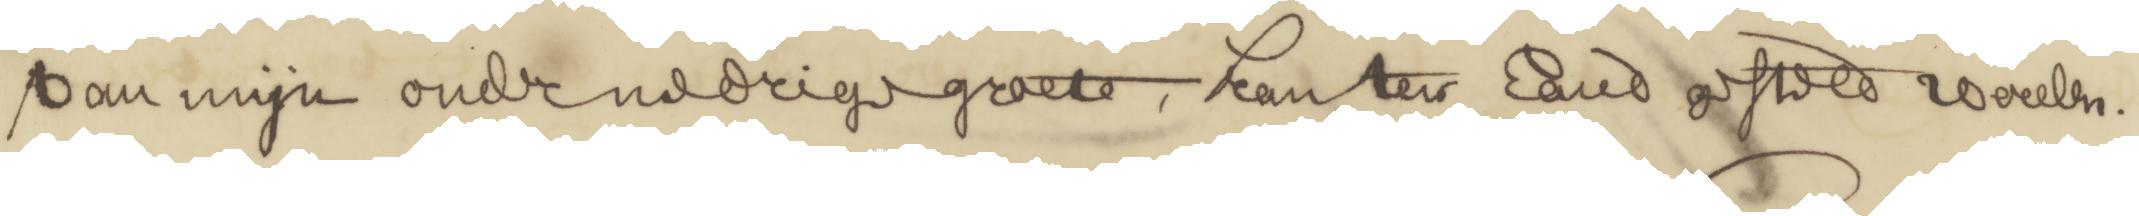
van mijn ondernedrige groete, kan ter hand gesteld werden.
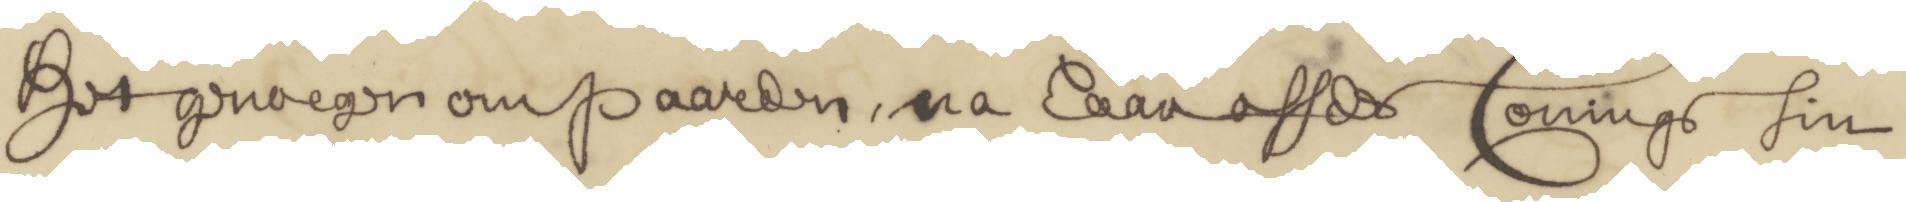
Het genoegen om paarden, na haar offdes Conings sin
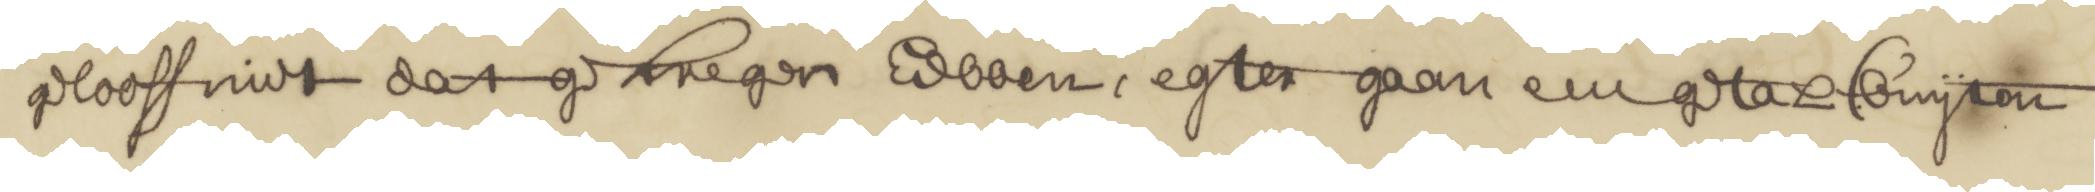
gelooff niet dat gekregen hebben, egter gaan een getal (:buijten
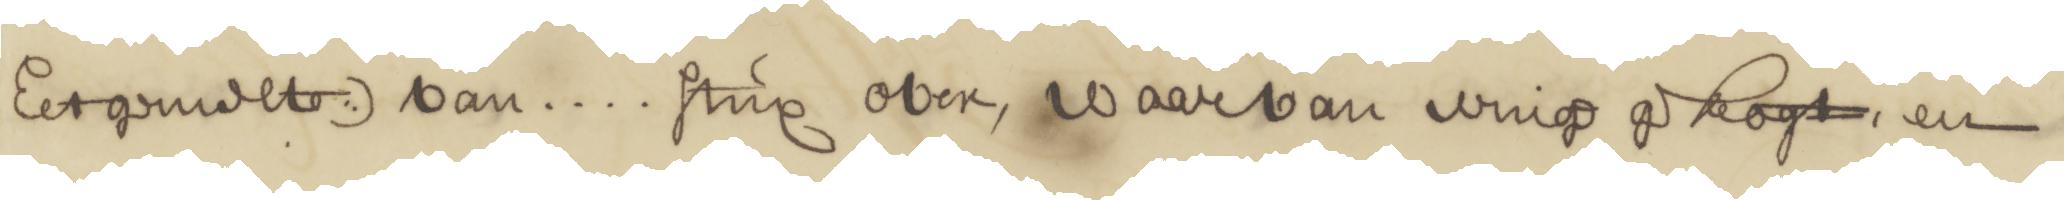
het gemelte:) van .... stux over, waarvan eenige gekogt, en
